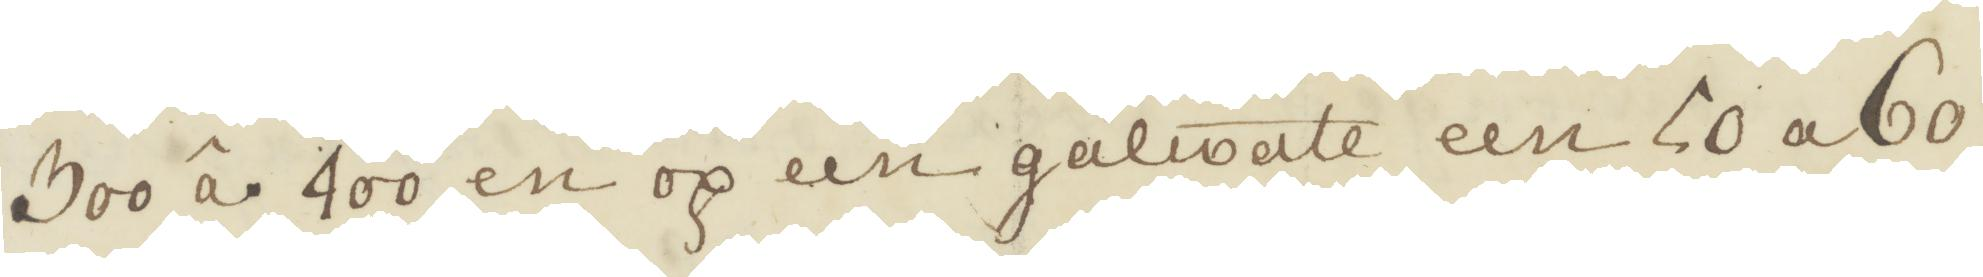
300 â 400 en op een galwate een 50 a 60
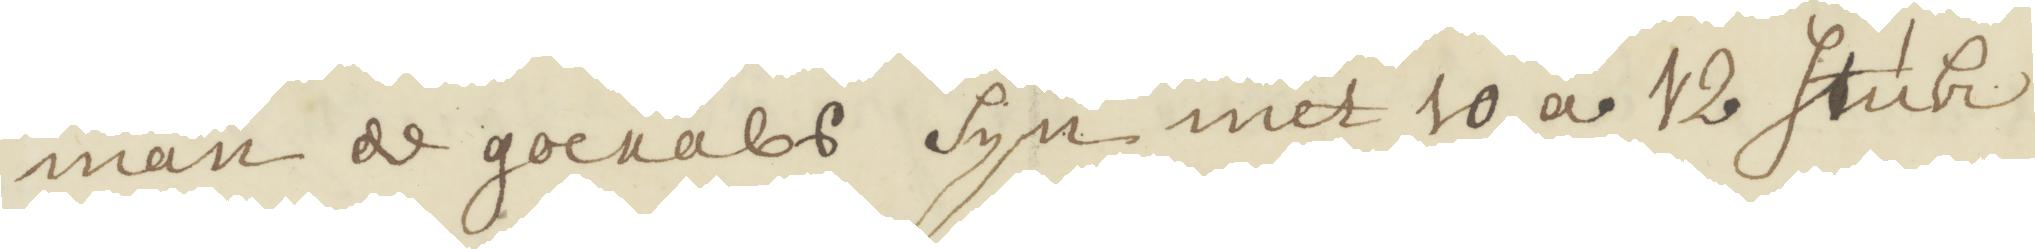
man de goerabs sijn met 10 a 12 stuk
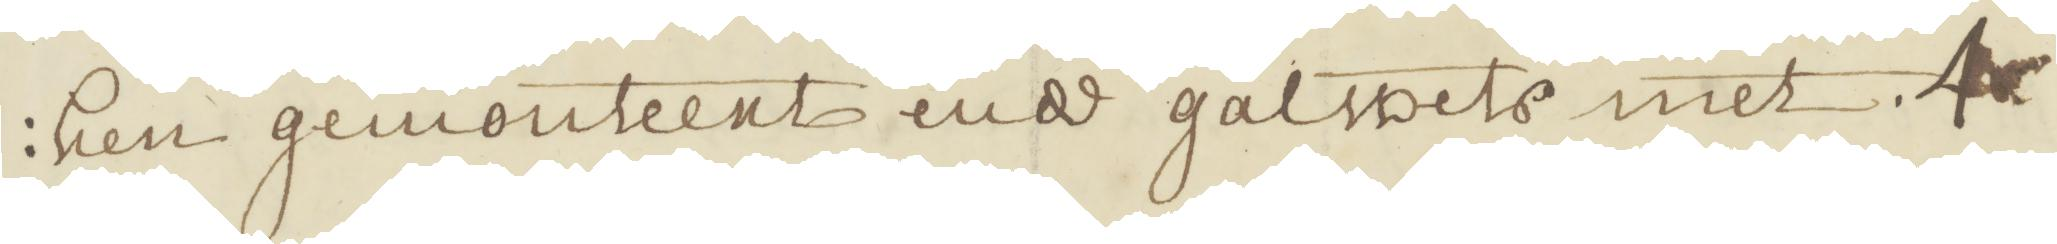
:ken gemonteert ende galwets met . . 4
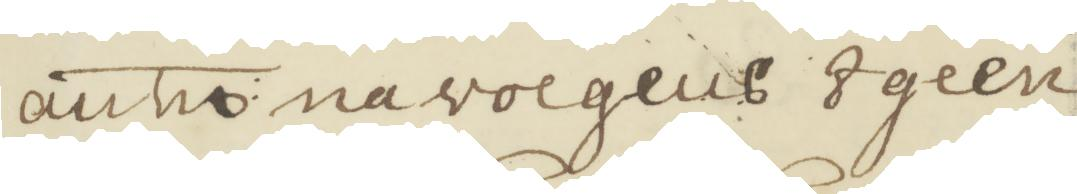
antw: na volgens t geen
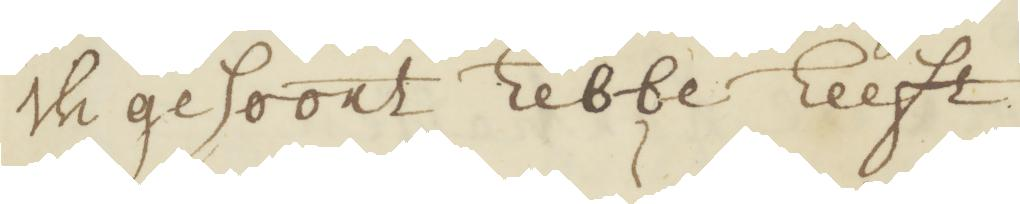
ik gehoort hebbe heeft
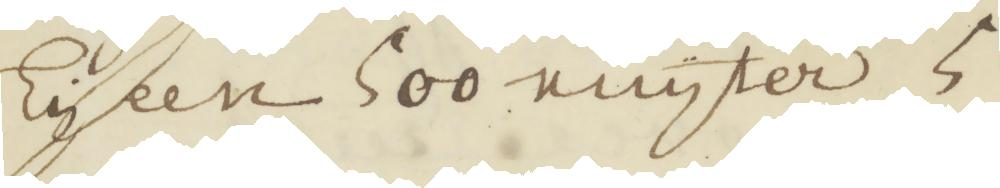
hij een 500 ruijter 5
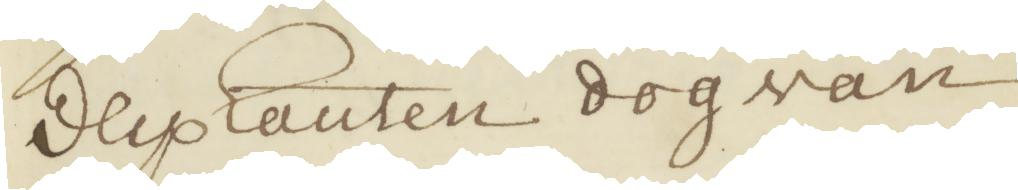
Eliphanten dog van
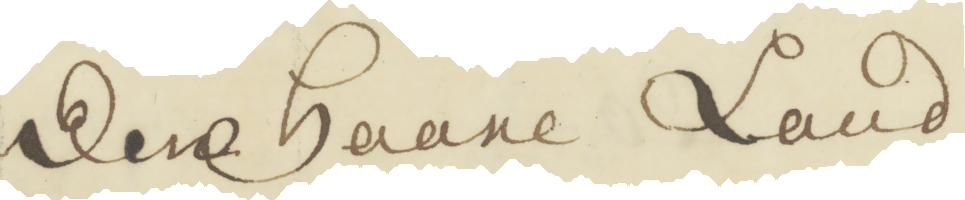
Een haare Land
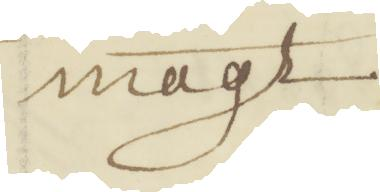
magt
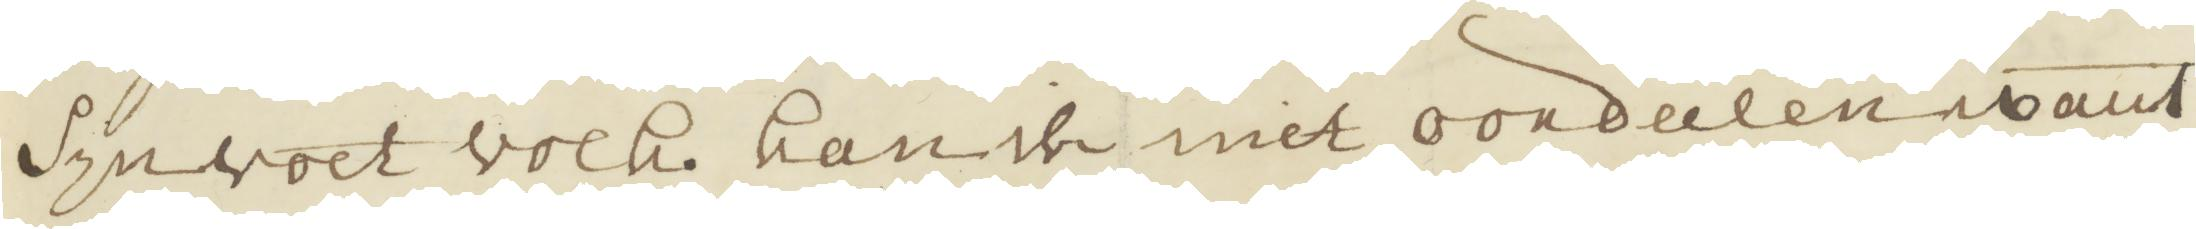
sijn voet volk kan ik niet oordeelen want
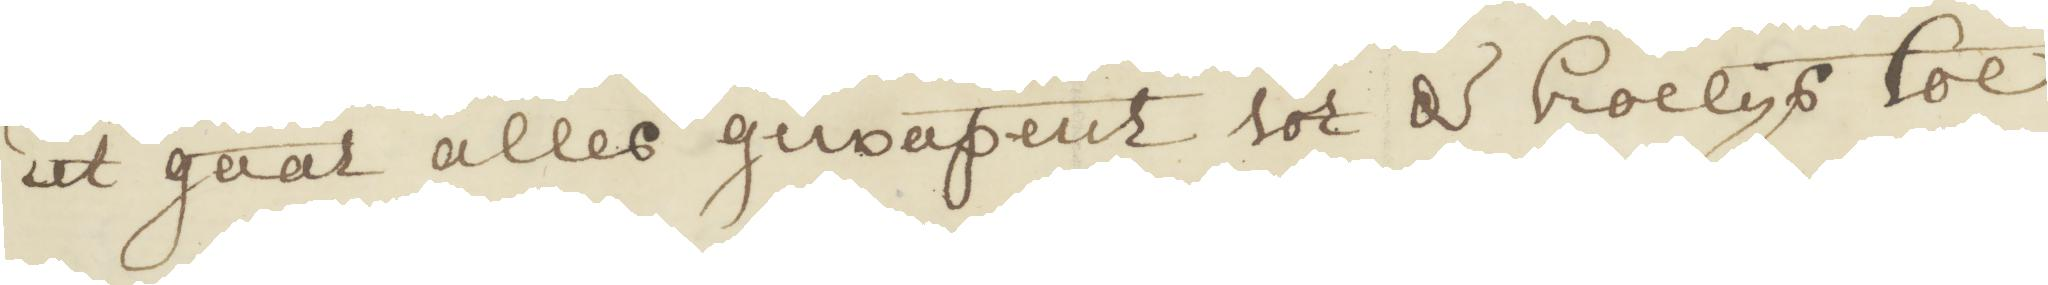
het gaat alles gewapent tot de koelijs toe
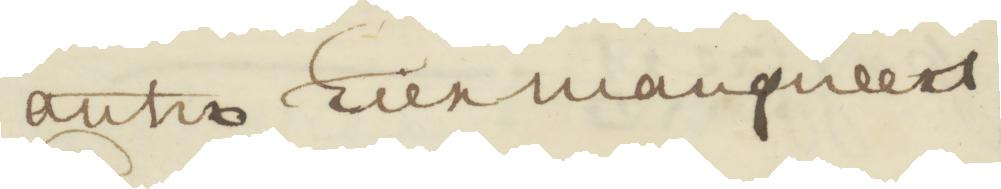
antw hier manqueert
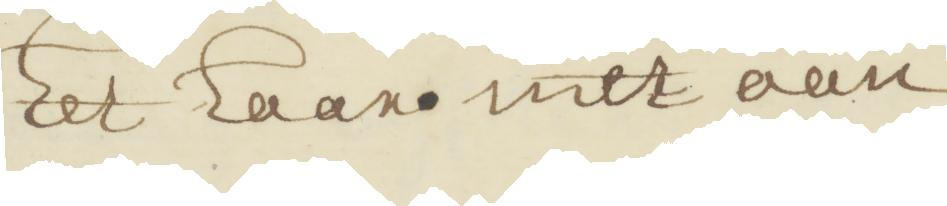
het haar niet aan
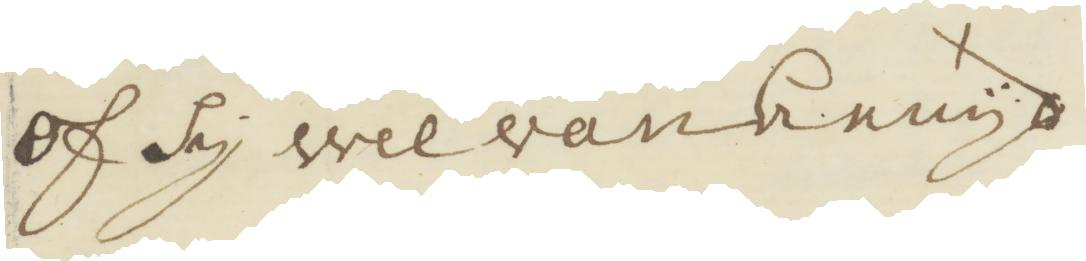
of sij wel van kruijd
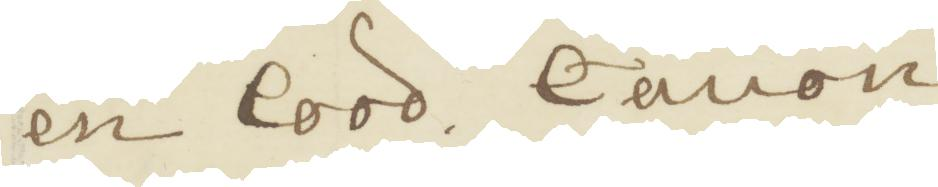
en lood Canon
